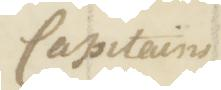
Capitains
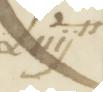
Luijtt
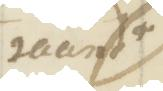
vaandr
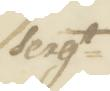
serg=t
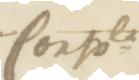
Corp=l
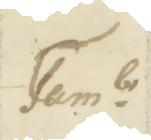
Tam=br
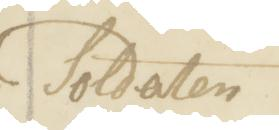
soldaten
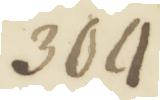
304
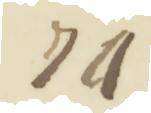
74
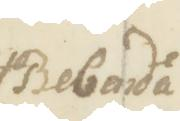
Bebenda
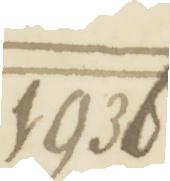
1936
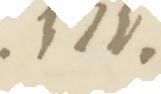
. 171.
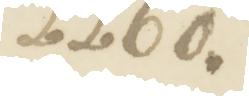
2260.
